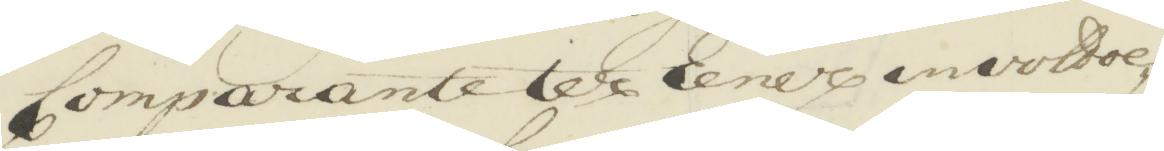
Comparante ter Eener in voldoe„
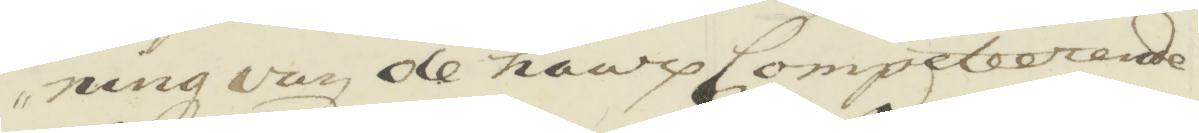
„ning van de haar Competeerende
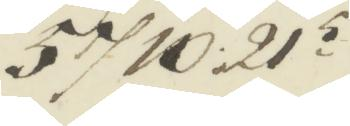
5710:21-5
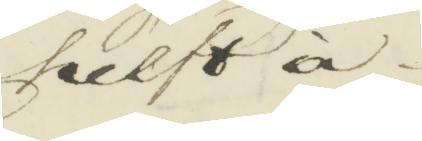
helft à
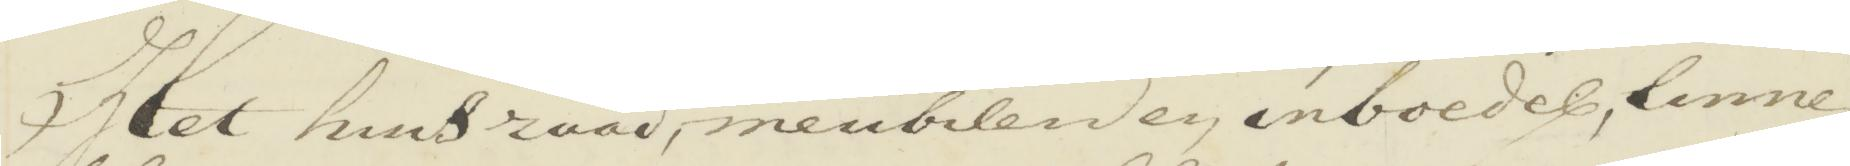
Het huis raad, meubelen en inboedel, linnen
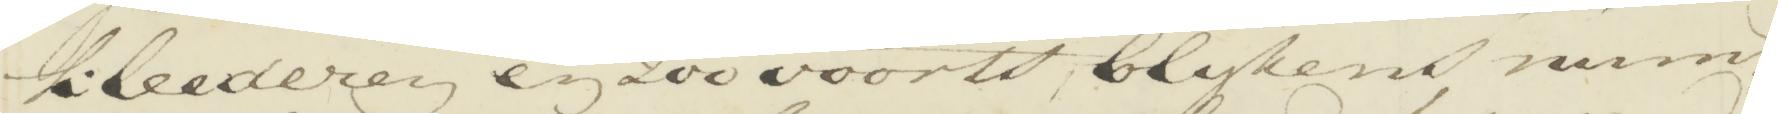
kleederen en zoo voorts, blykens num
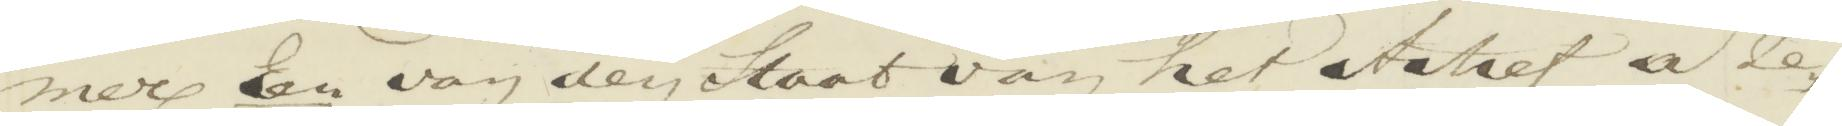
mer Een van den staat van het Actief a ze„
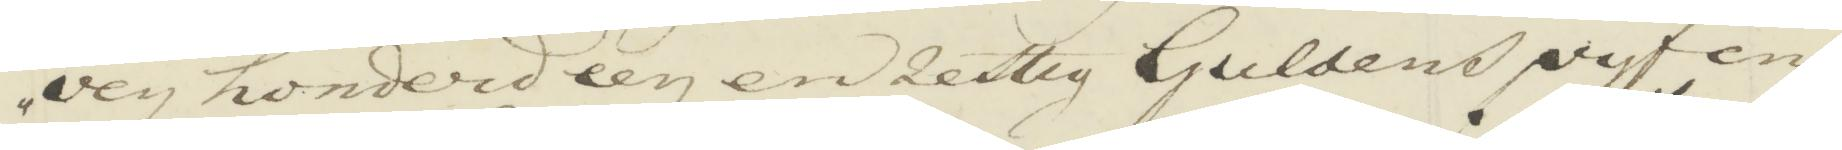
„ven honderd een en zestig Guldens vyf en
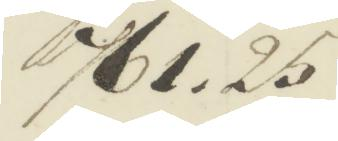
761,25
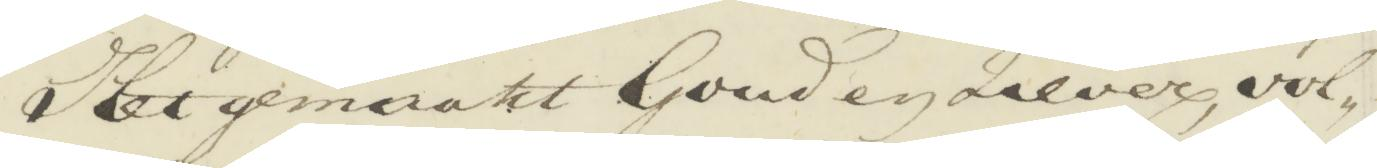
Het gemaakt Goud en Zilver, vol„
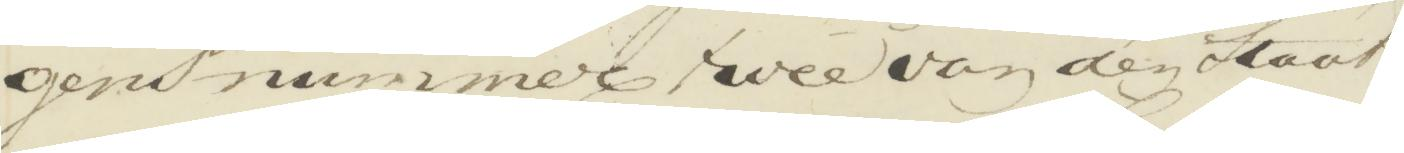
gens nummer twee van den Staat
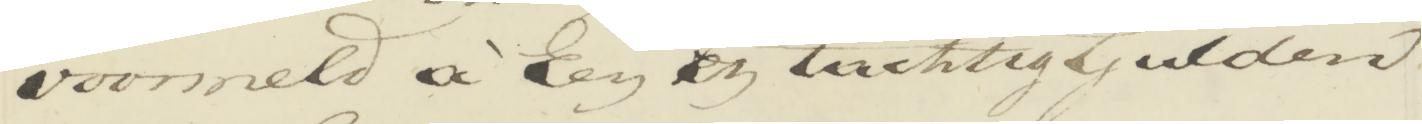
voormeld à Een en tachtig Gulden
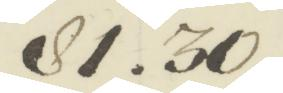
81.30
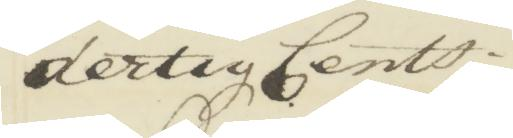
dertig Cents -
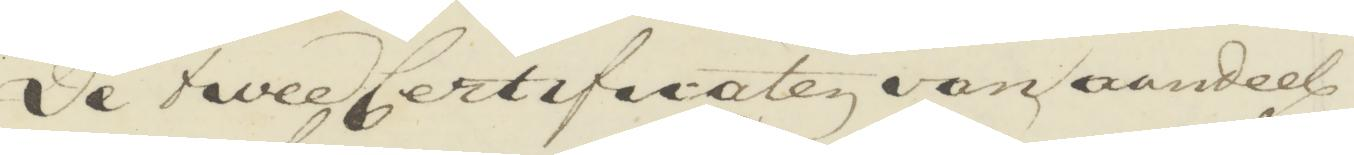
De twee Certificaten van aandeel
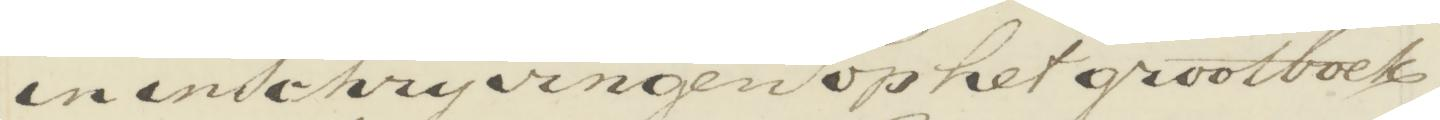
in inschryvingen op het grootboek
